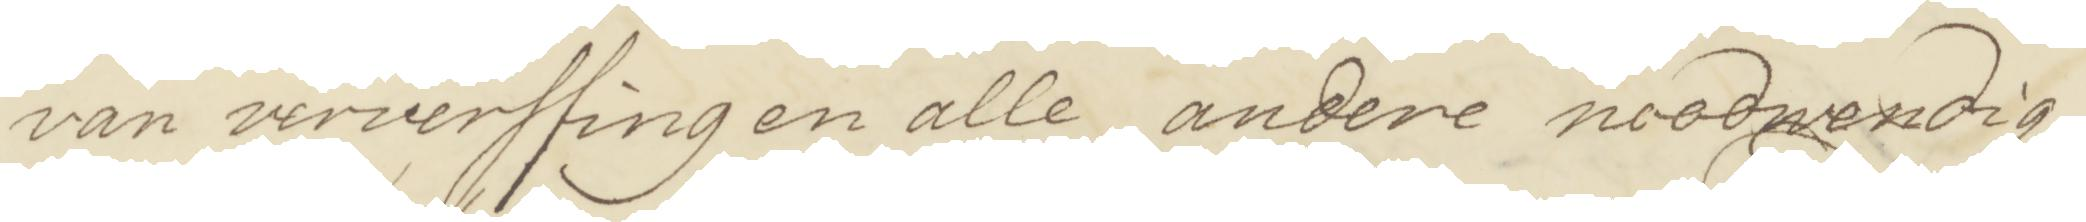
van ververssing en alle andere noodwendig
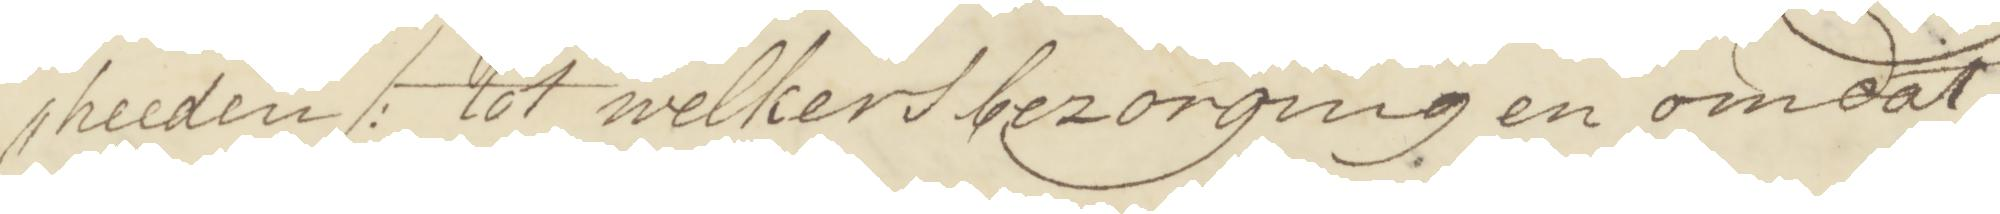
heeden /: tot welkers bezorging en om dat
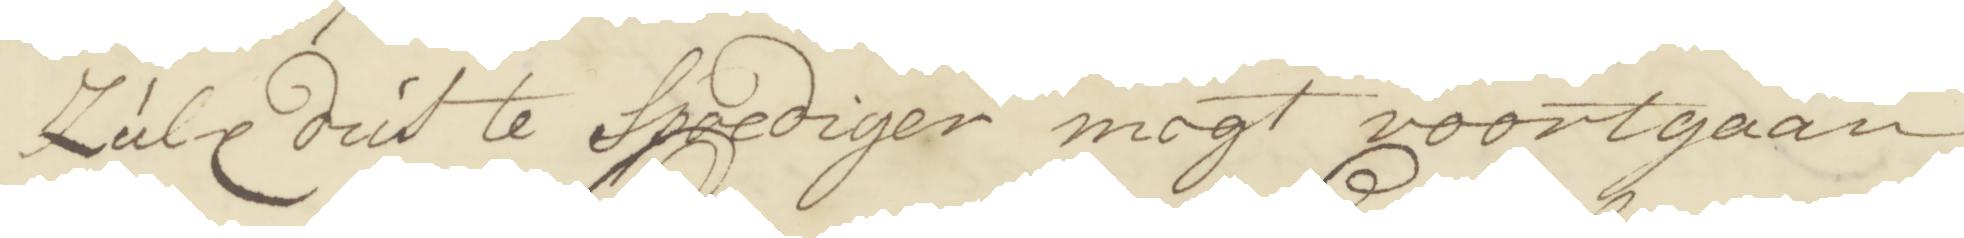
zulx dus te spoediger mogt voortgaan
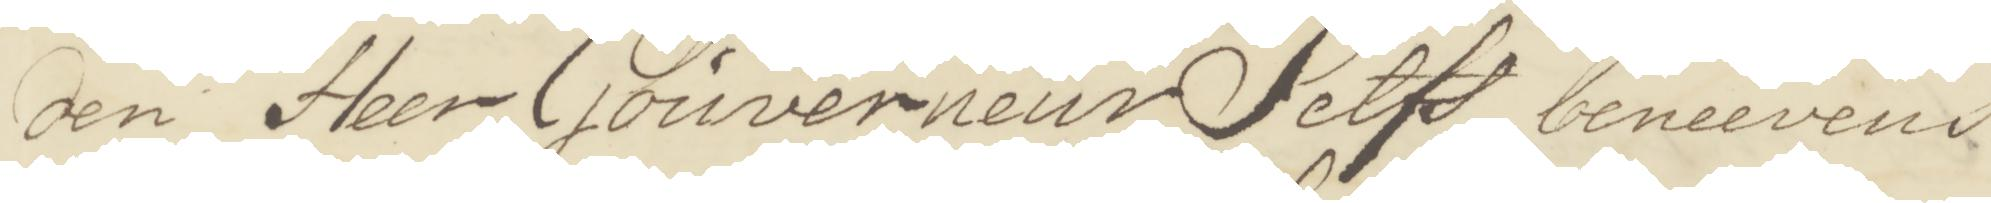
den Heer Gouverneur selfs beneevens
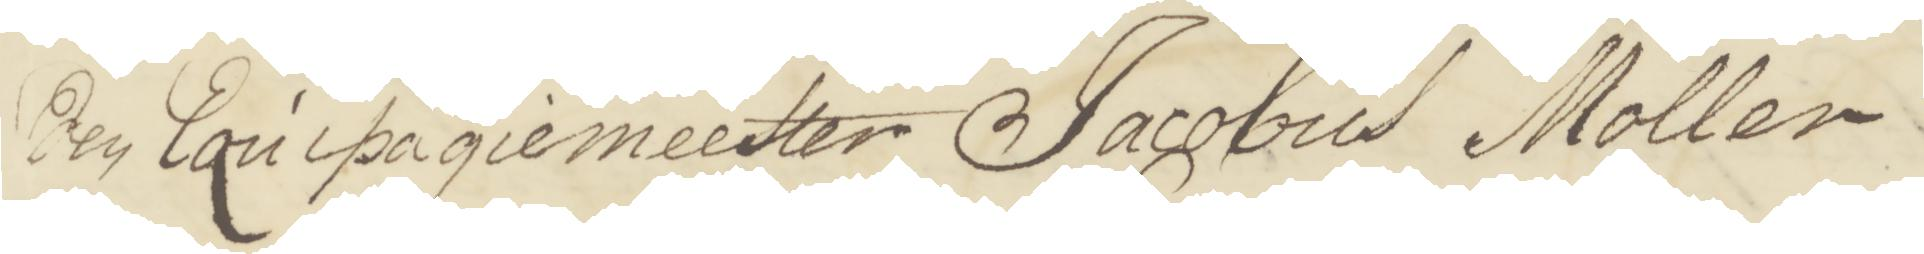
den Equipagiemeester Iacobus Moller
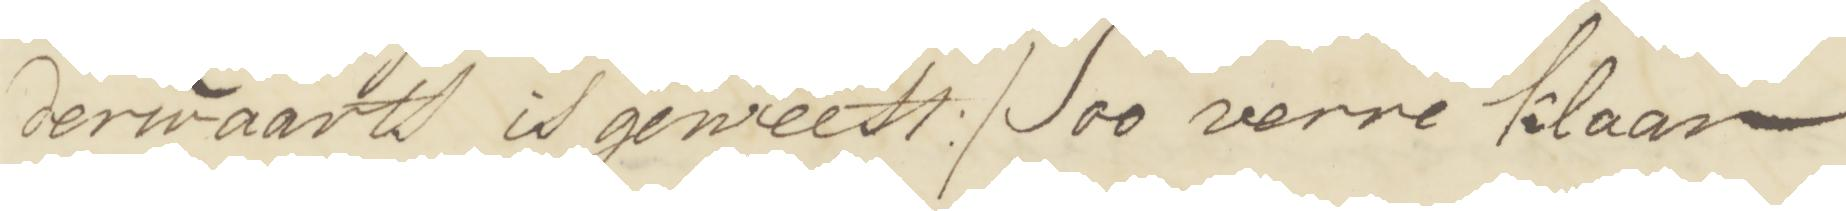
derwaarts is geweest :/ soo verre klaar
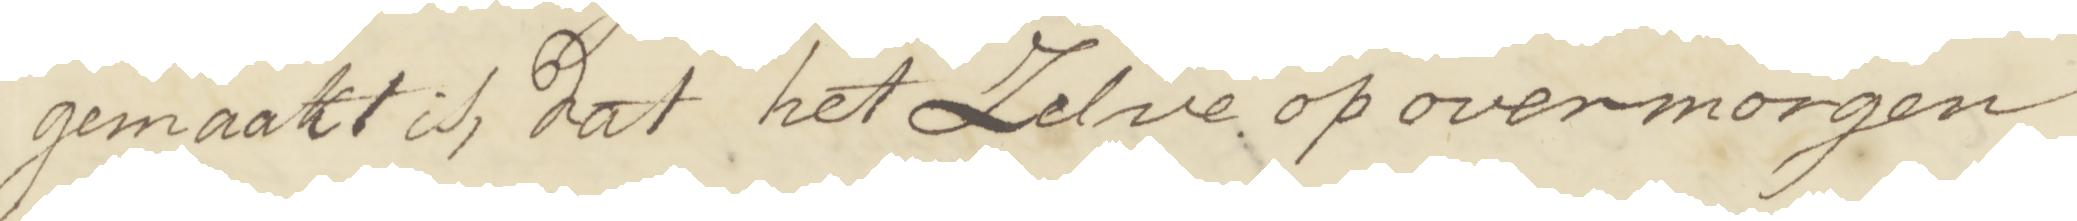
gemaakt is, dat het zelve op overmorgen
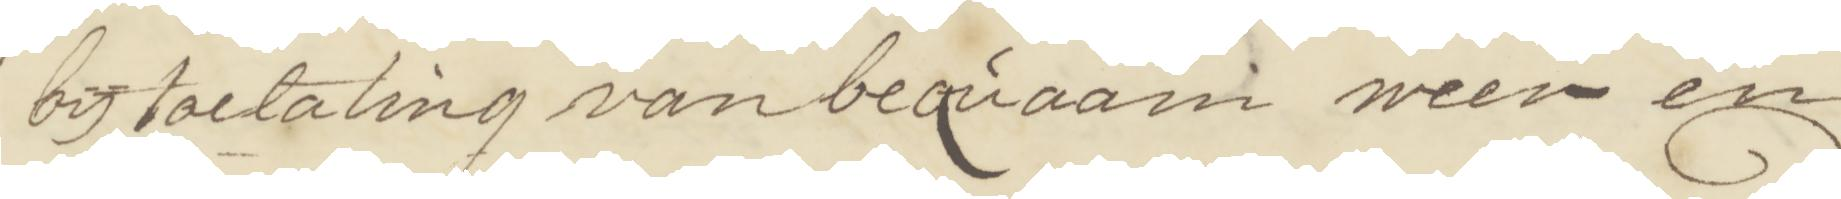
bij toelating van bequaam weer en
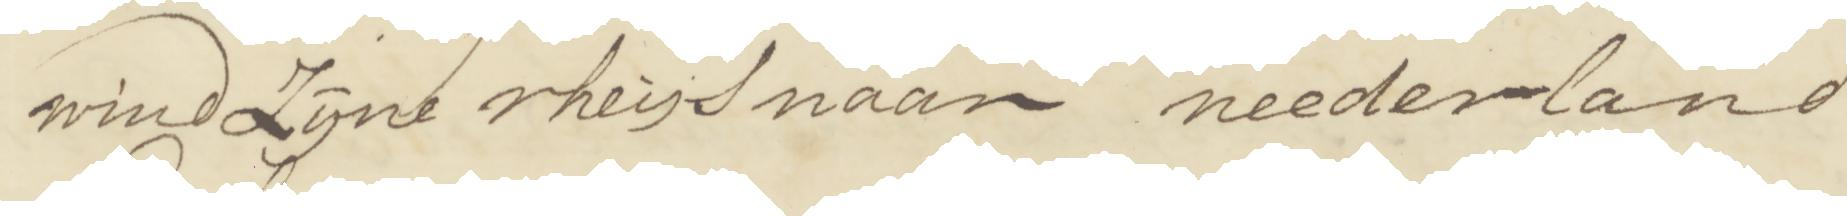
wind zijne rheijs naar neederland
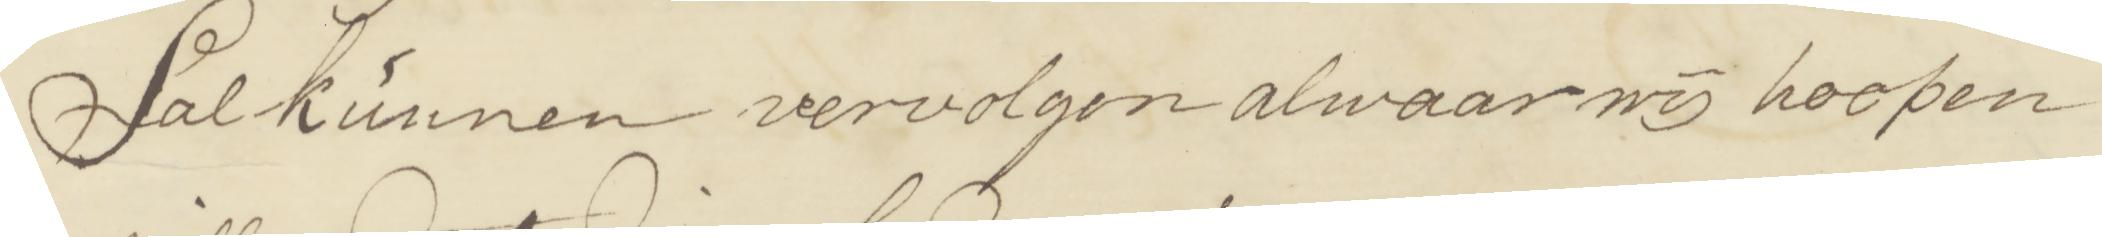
sal kunnen vervolgen alwaar wij hoopen
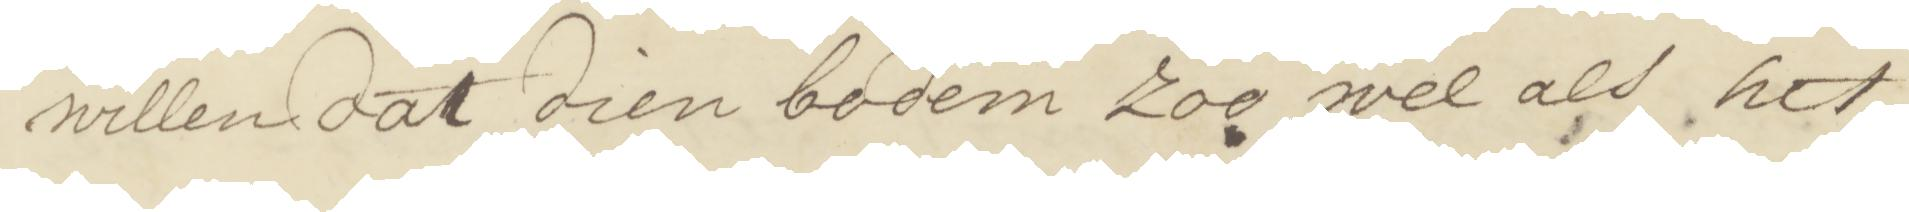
willen dat dien bodem zoo wel als het
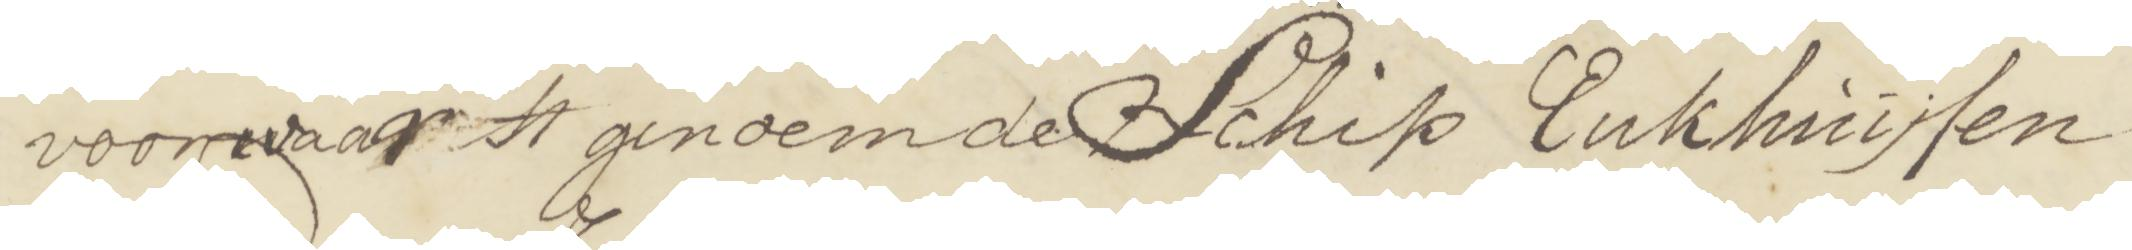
voorwaarst genoemde schip Enkhuijsen
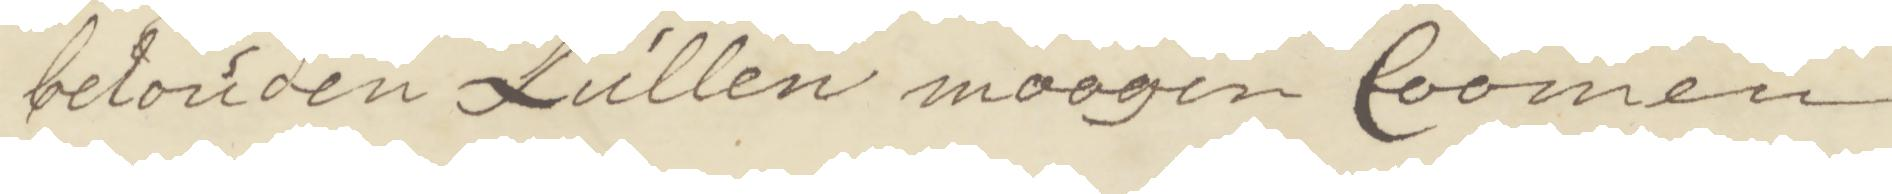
behouden zullen moogen coomen
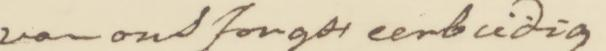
van ons Jongst eerbiedig
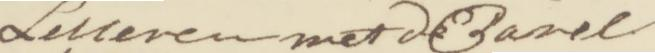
Letteren met de Pavel
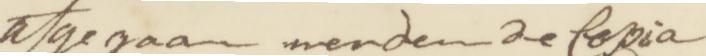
afgegaan werden de Copia
